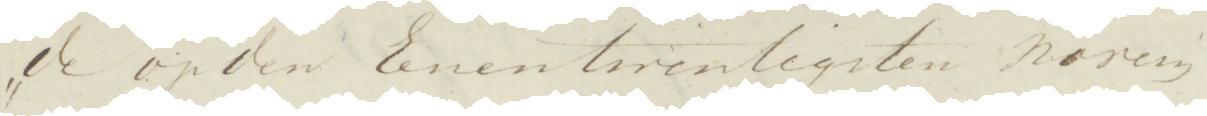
„de op den Eenen twintigsten Novem
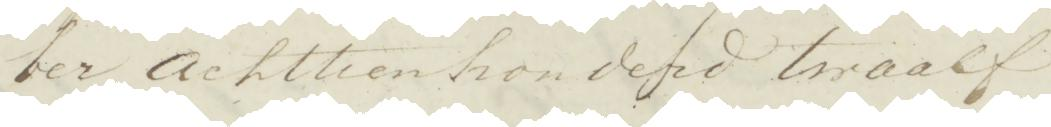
ber achttien honderd twaalf
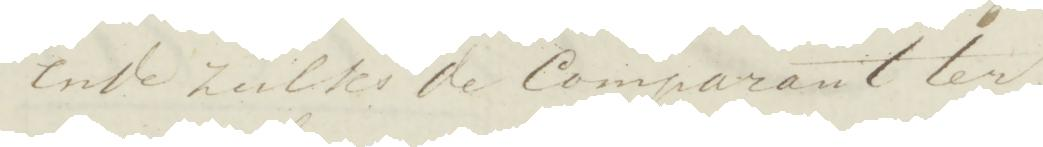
ende zulks de Comparant ter
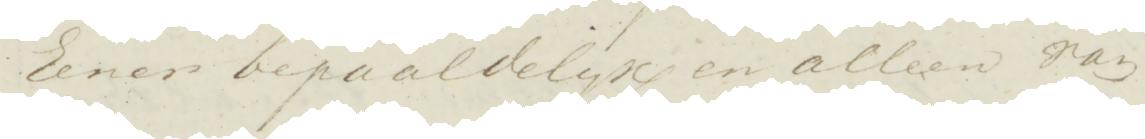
Eener bepaaldelyk en alleen van
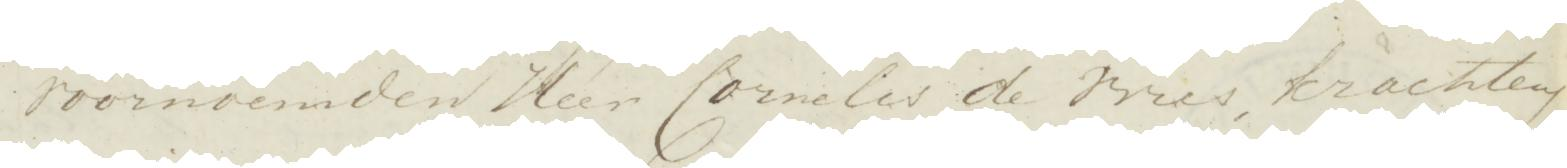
voornoemden Heer Cornelis de Vries, krachtens
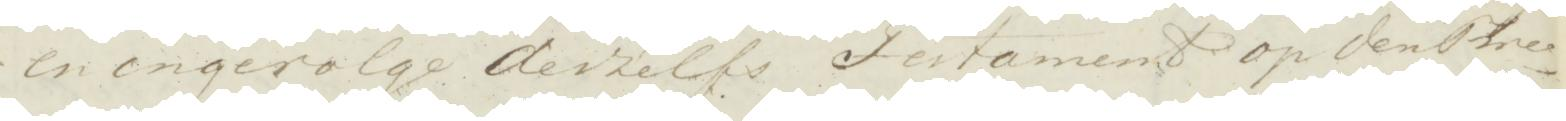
en ingevolge deszelfs Testament op den Twee
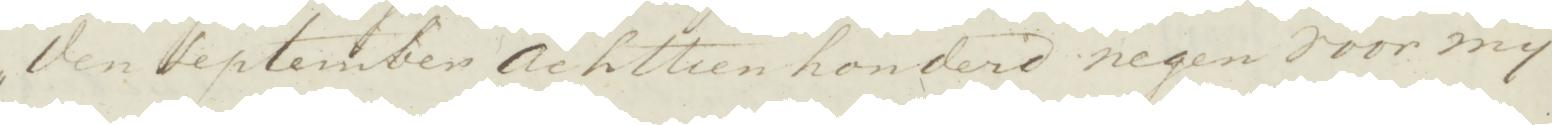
den september achttien honderd negen voor mij
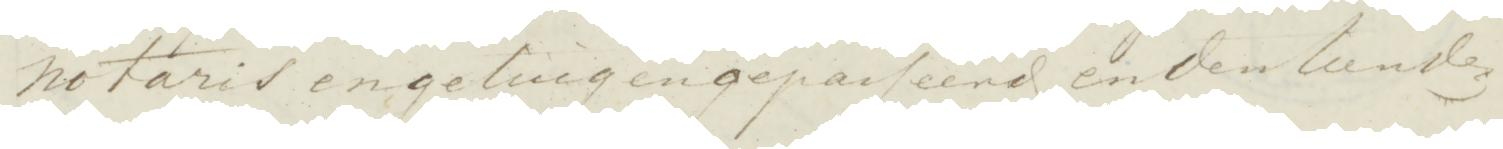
notaris en getuigen gepasseerd en den tienden
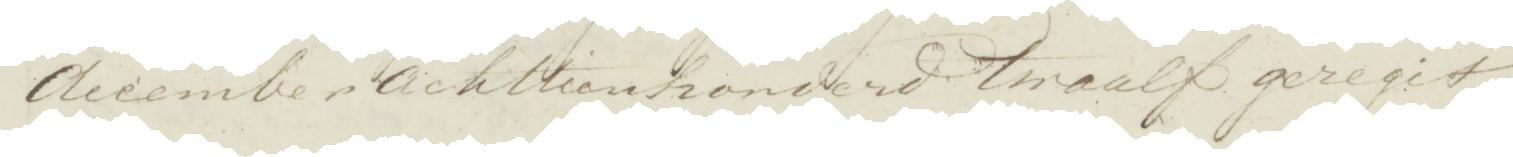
december achttienhonderd twaalf geregis
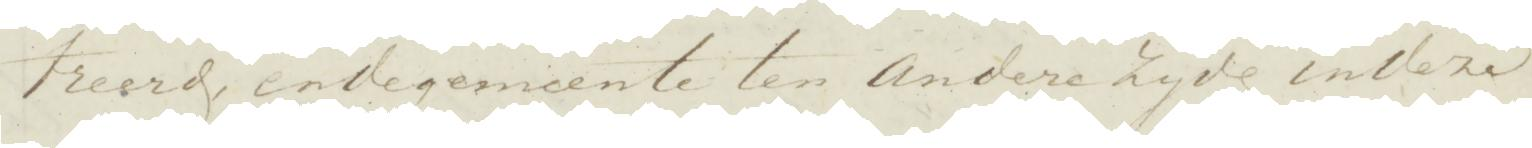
treerd, en de gemeente ten andere zyde in deze
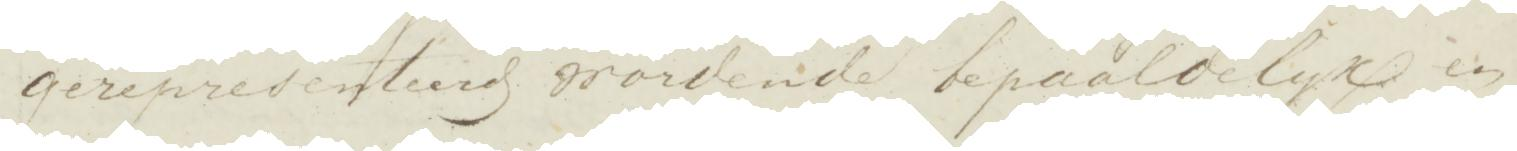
gerepresenteerd wordende bepaaldelyk in
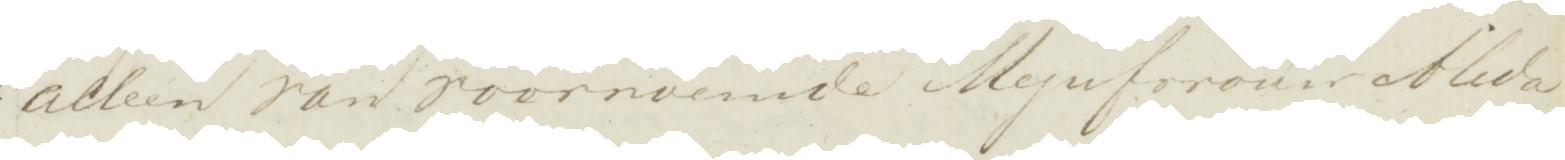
alleen van voornoemde Mejufvrouw Alida
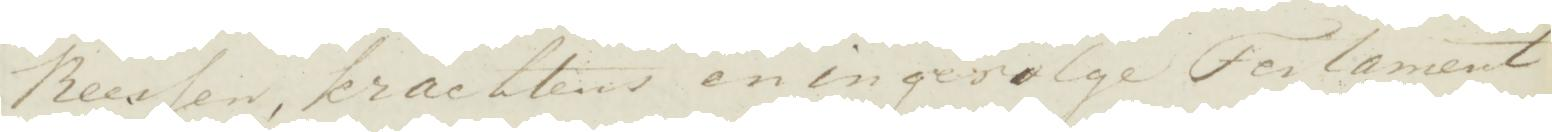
Reessen, krachtens en ingevolge Testament
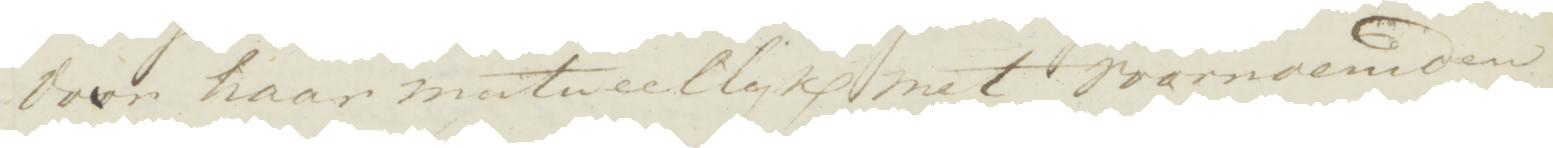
doon haar mutueellyk met voornoemden
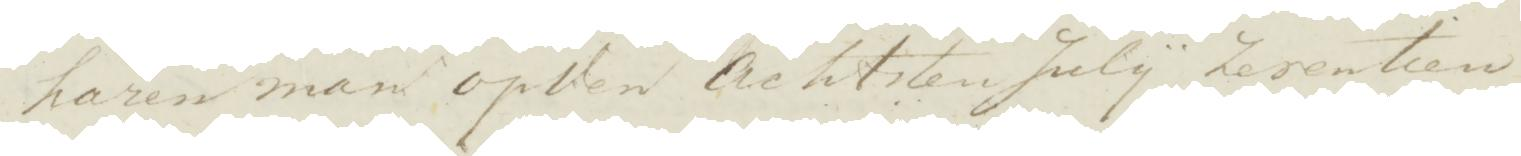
haren man op den Achtsten Julij zeventien
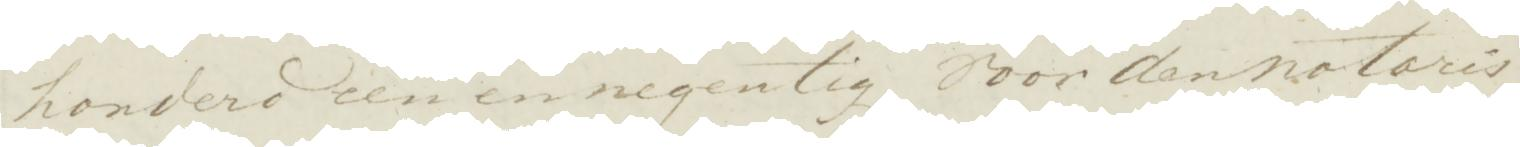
honderd een en negentig voor den notaris
